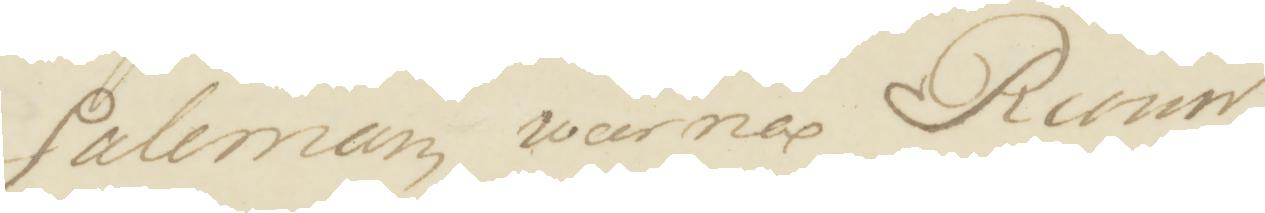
Saleman weer na Riouw
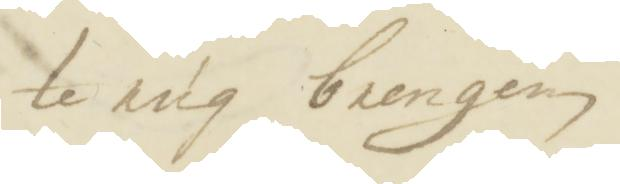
te rug brengen
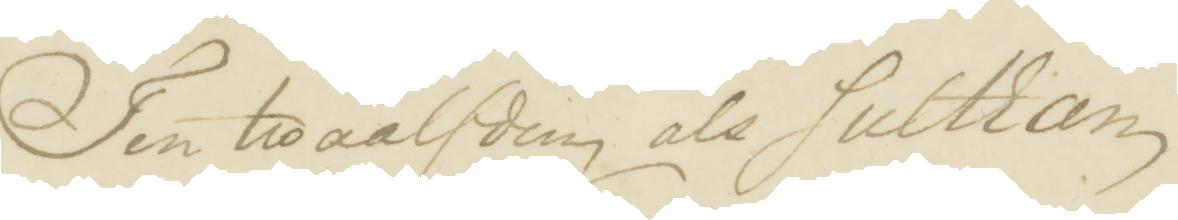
Ten twaalfden als Sulthan
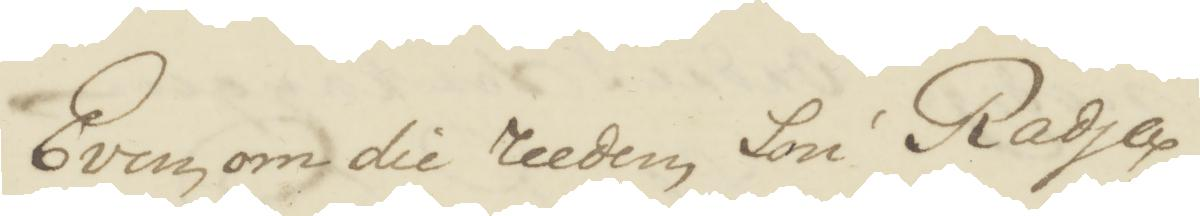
Even om die reeden Sou Radja
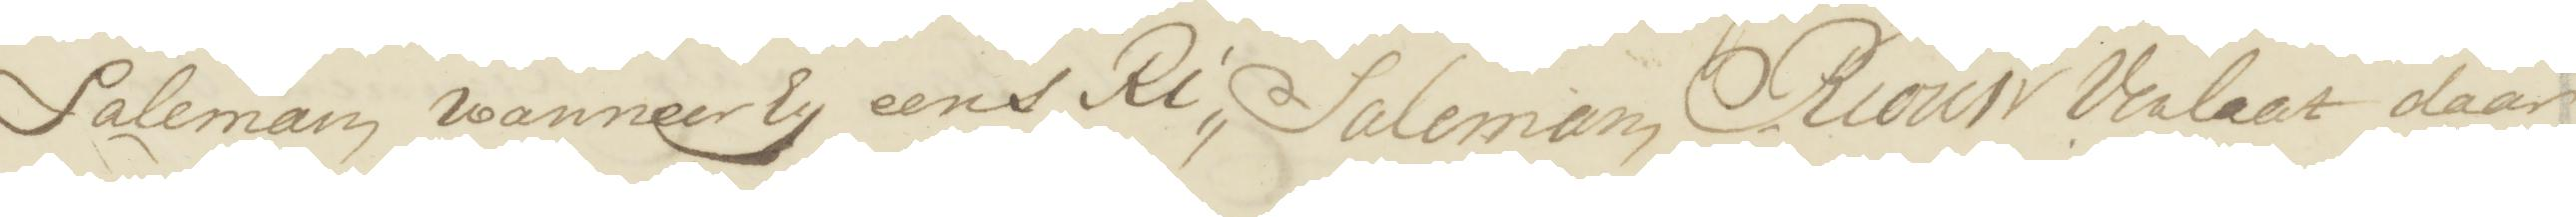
Saleman wanneer hy eens Ri„ Saleman Riouw verlaat daar
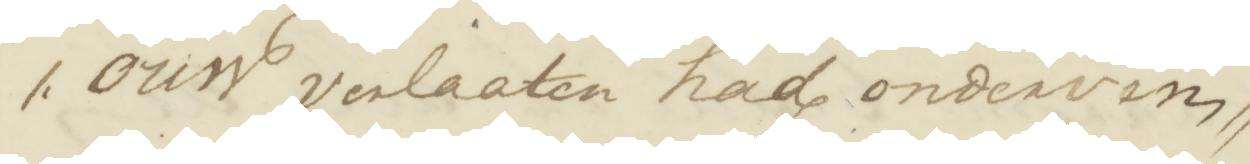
„ouw verlaaten had ondervin„
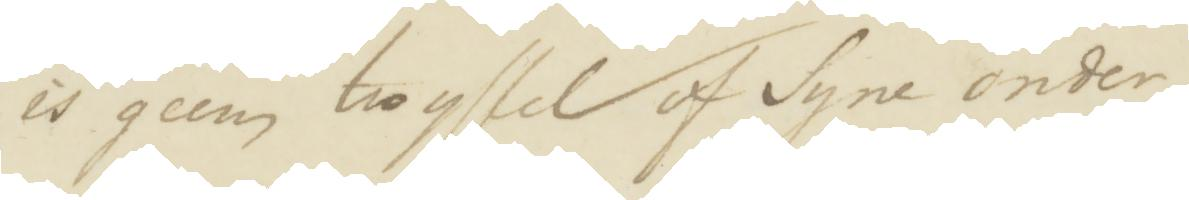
is geen twyftel of Syne onder
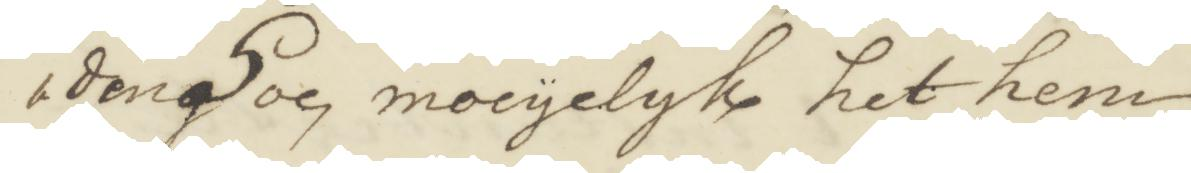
„deng Hoe moeijelyk het hem
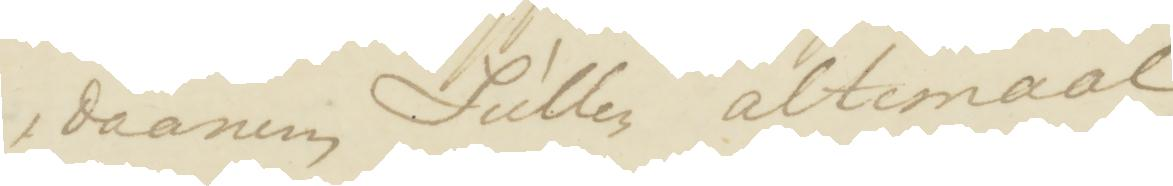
„daanen Sullen altemaal
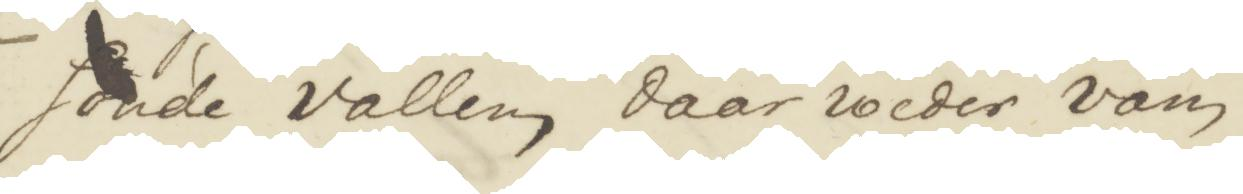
Soude vallen daar weder van
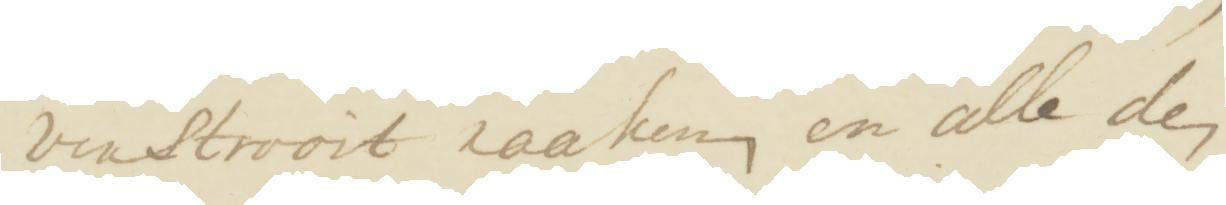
verstrooit raaken en alle de
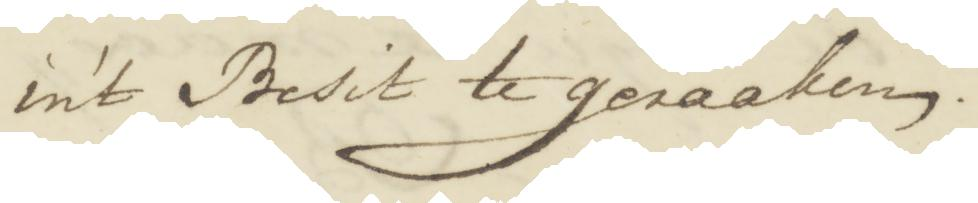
in't Besit te geraaken.
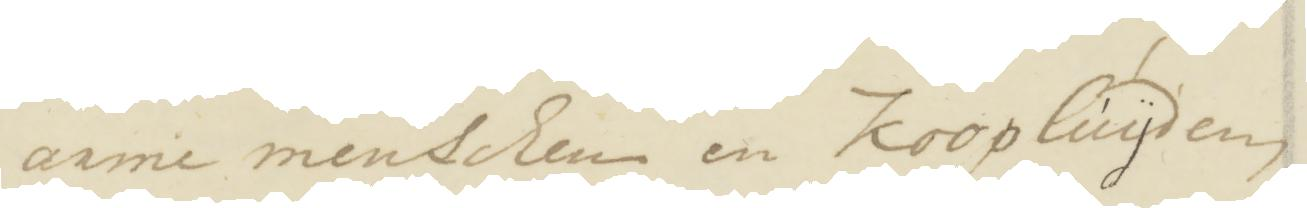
arme menschen en koopluijden
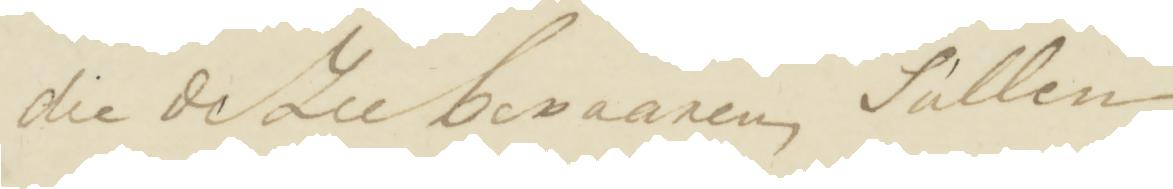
die de Zee bevaaren Sullen
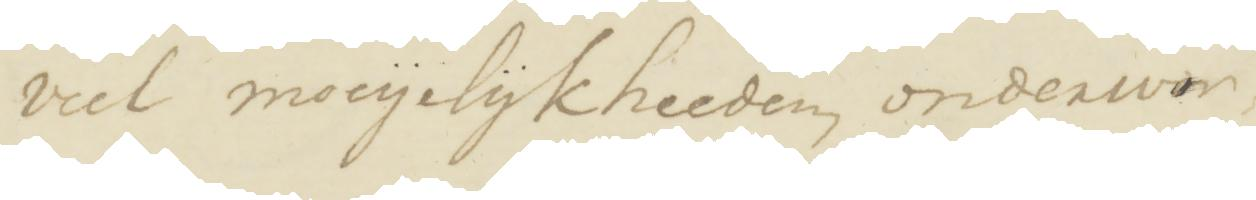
veel moeijelijkheeden onderwor„
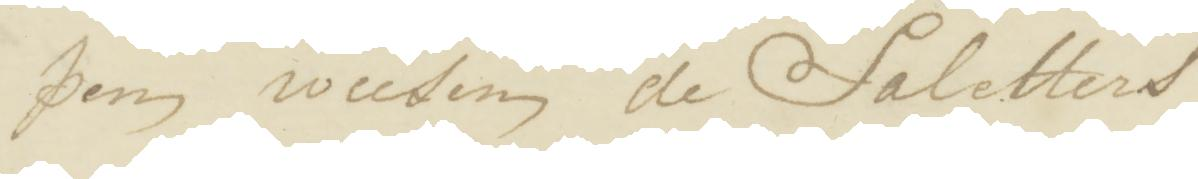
pen weesen de Saletters
